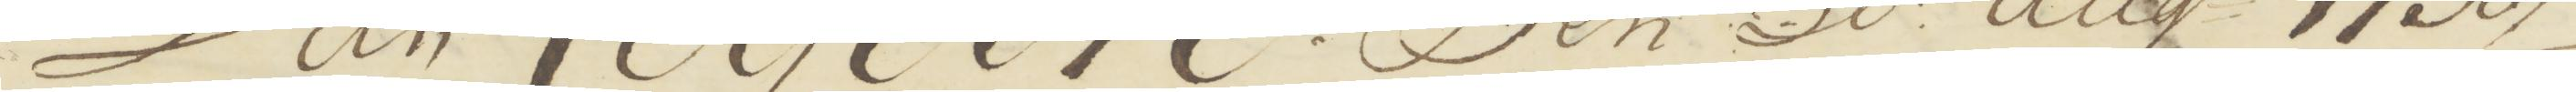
Van Ceijlon Den 30: Aug=o 1738
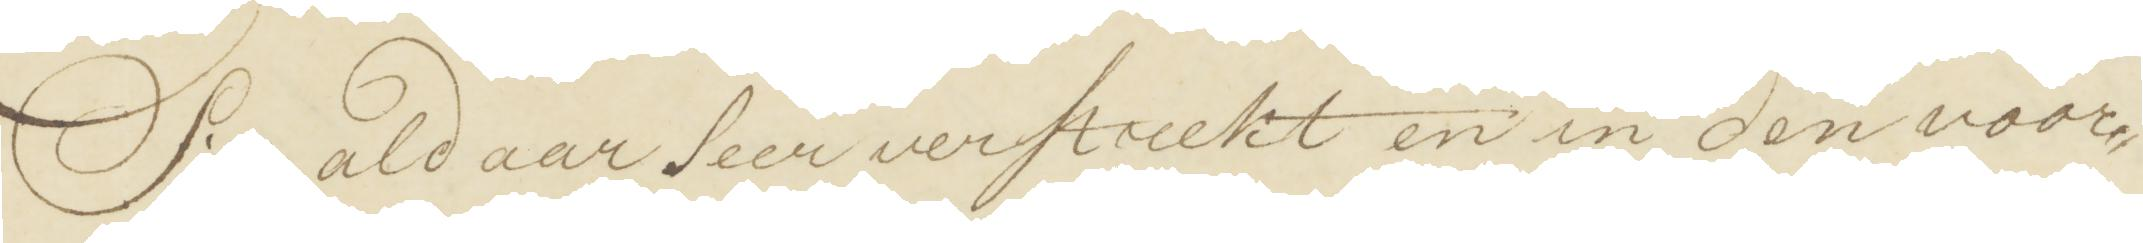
Sig aldaar seer verstrekt en in den voor„
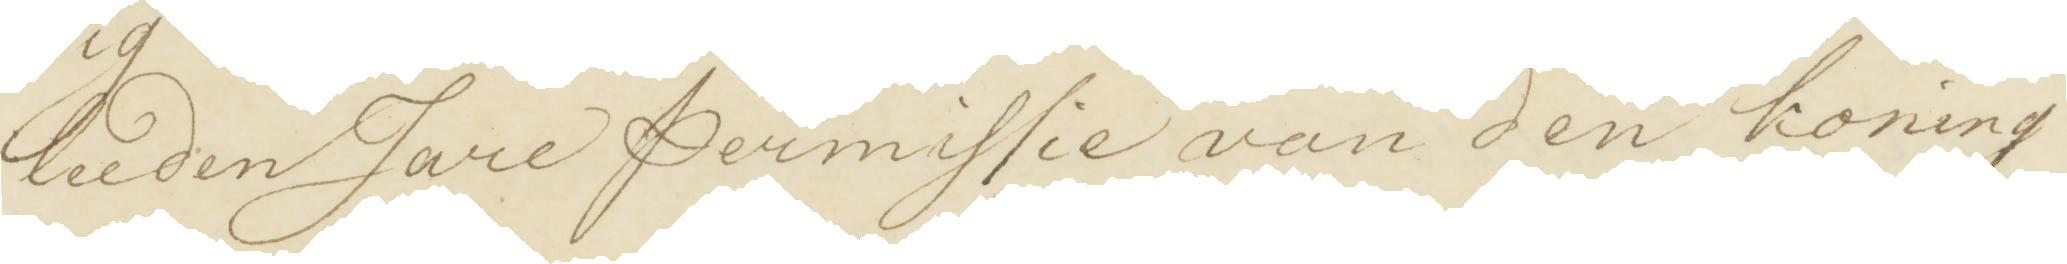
leeden Jare Permissie van den koning
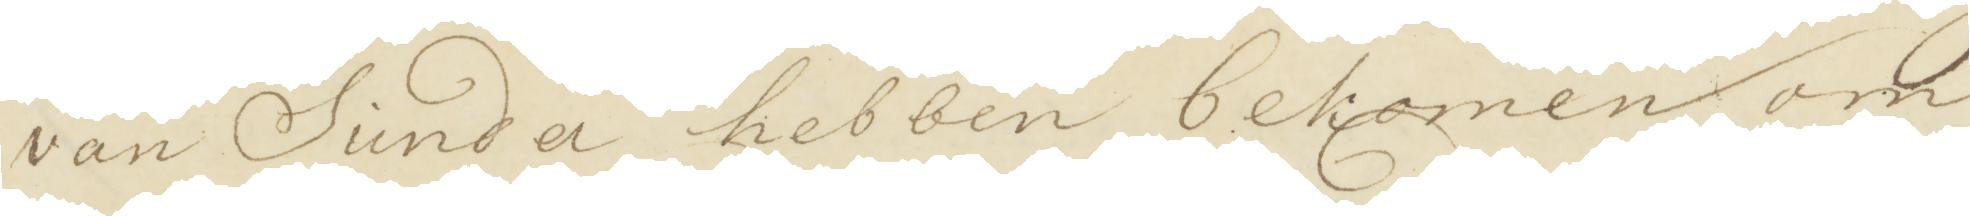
van Sunda hebben bekomen om
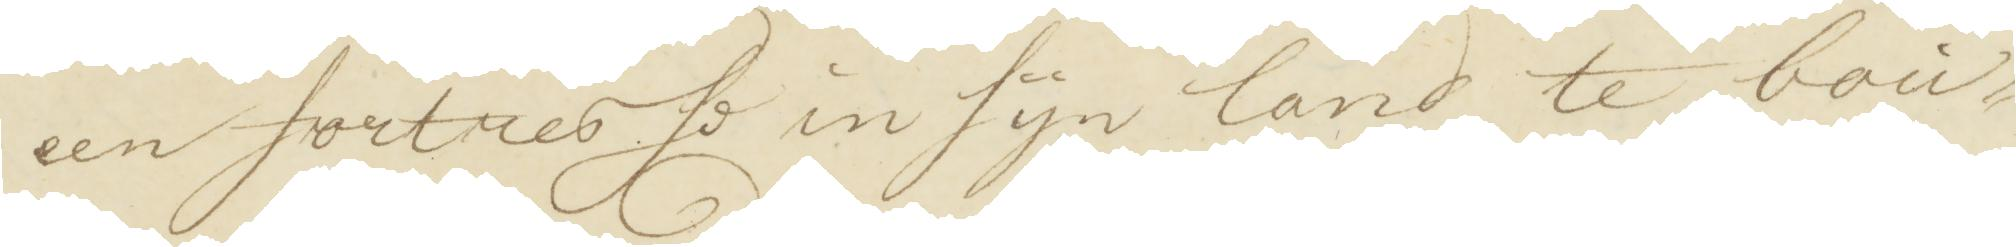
een fortresse in sijn land te bou„
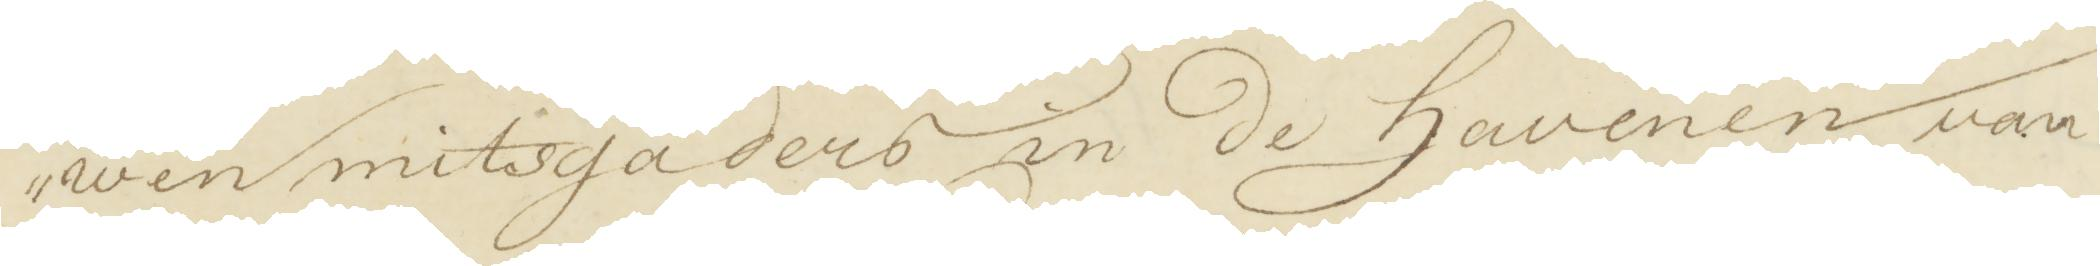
„wen mitsgaders in de havenen van
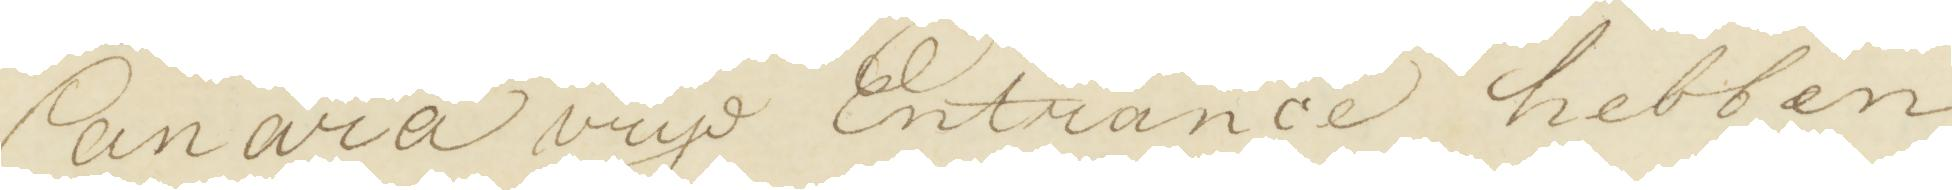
Canara vrije Entrance hebben
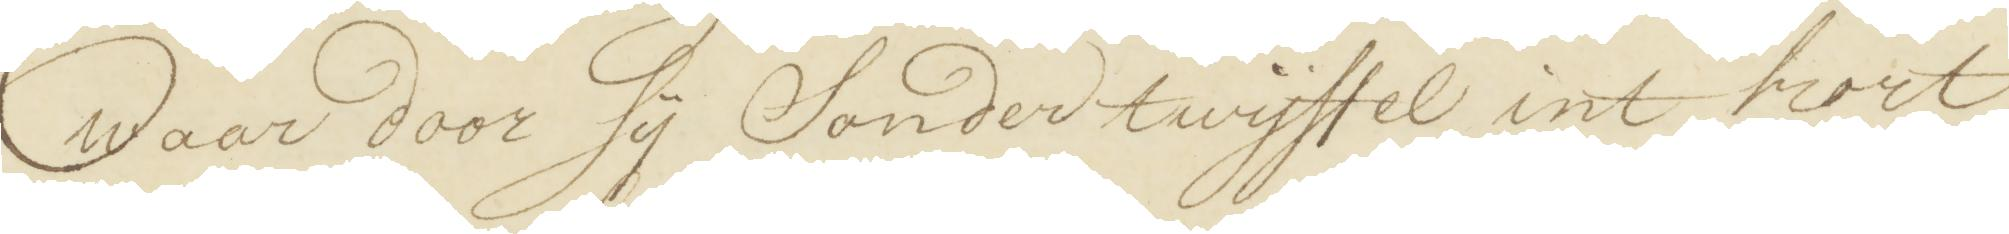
waar door sij sonder twijffel int kort
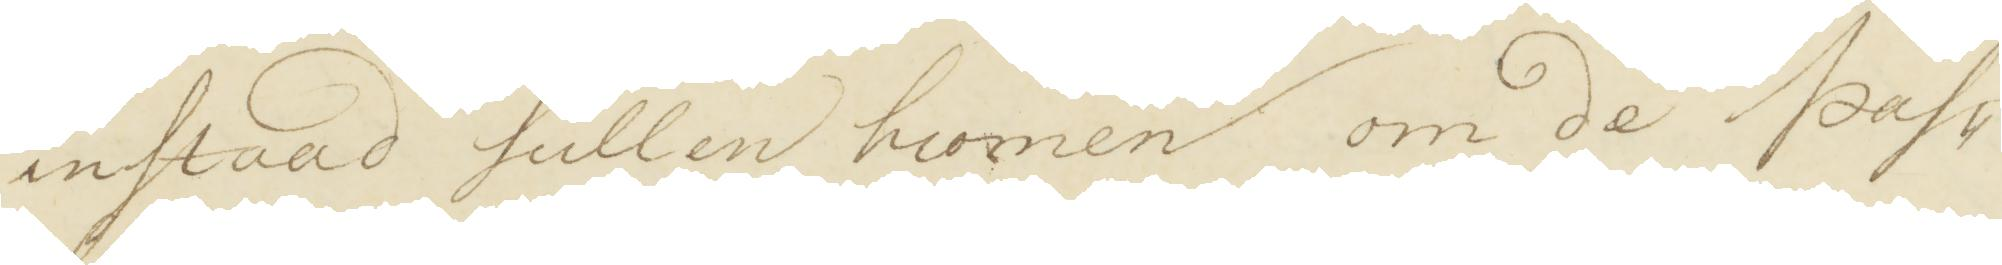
instaad sullen komen om de pas„
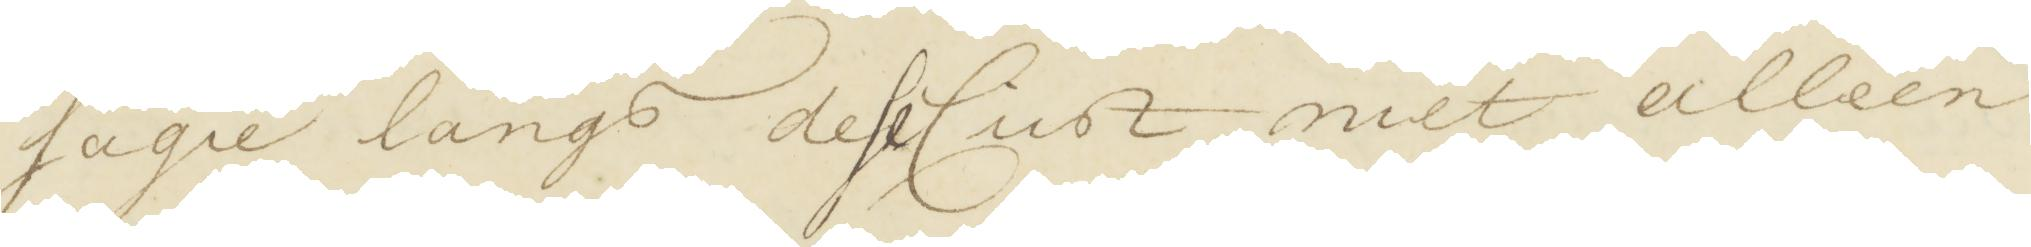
sagie langs dese Cust niet alleen
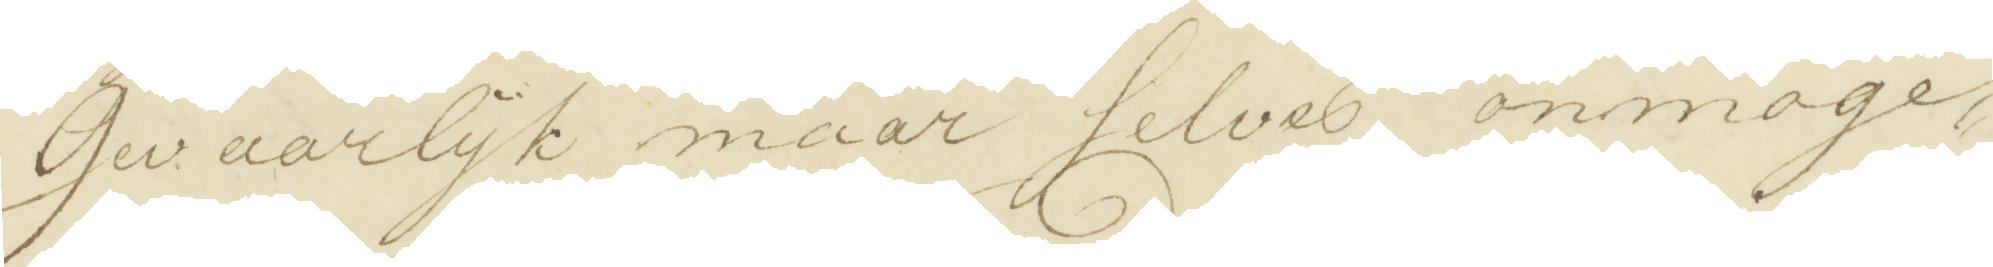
Gevaarlijk maar selves onmoge„
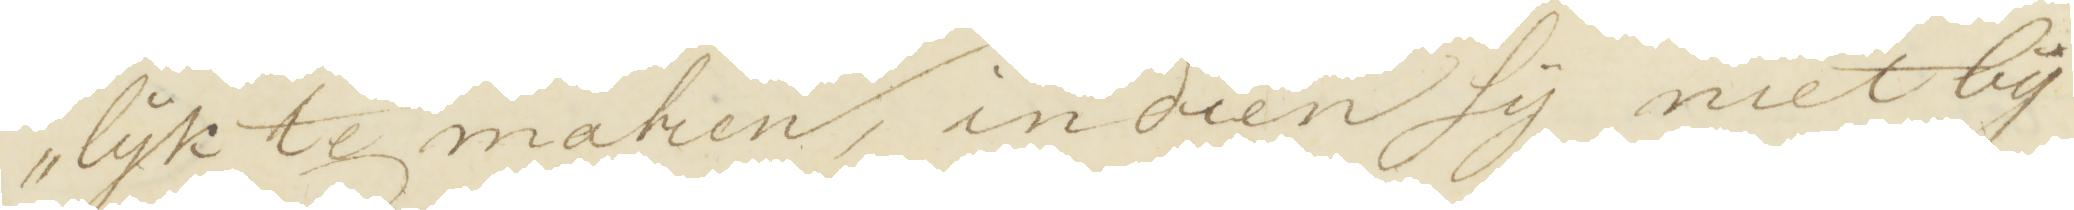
„lijk te maken, in dien sij niet bij
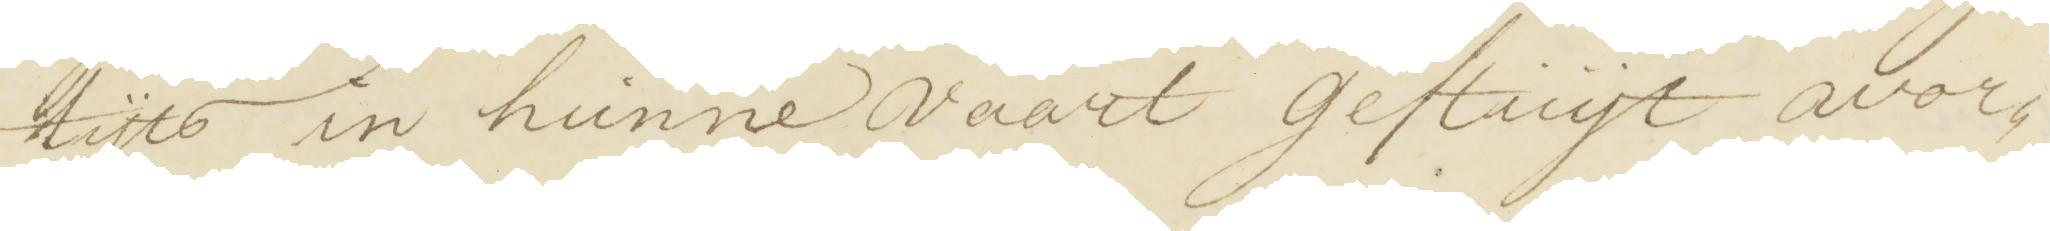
tijts in hunne vaart gestuijt wor„
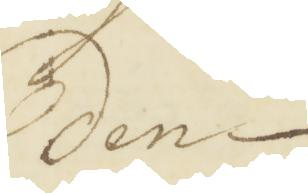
den —
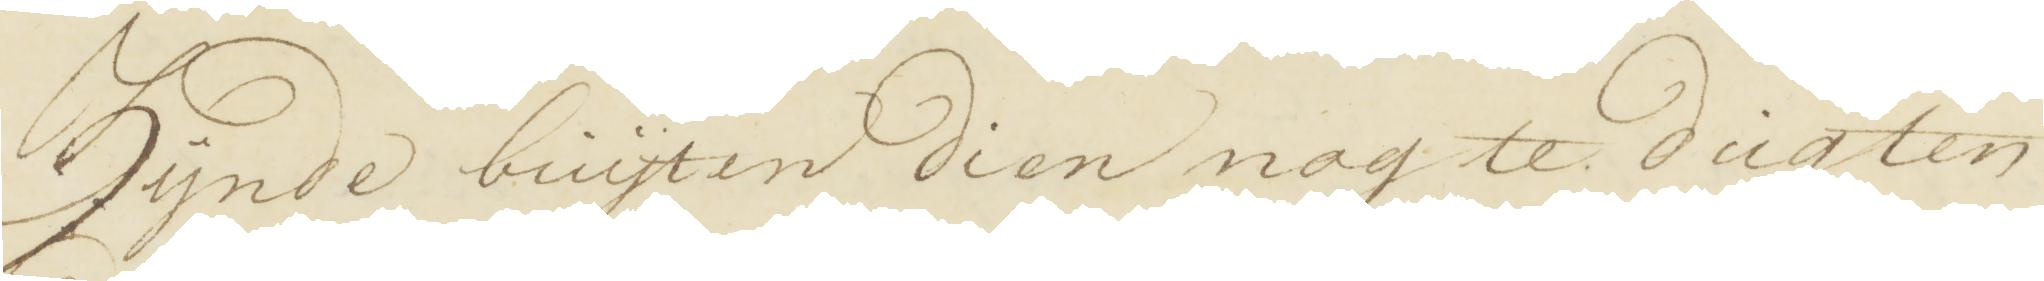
Zijnde buijten dien nog te dugten
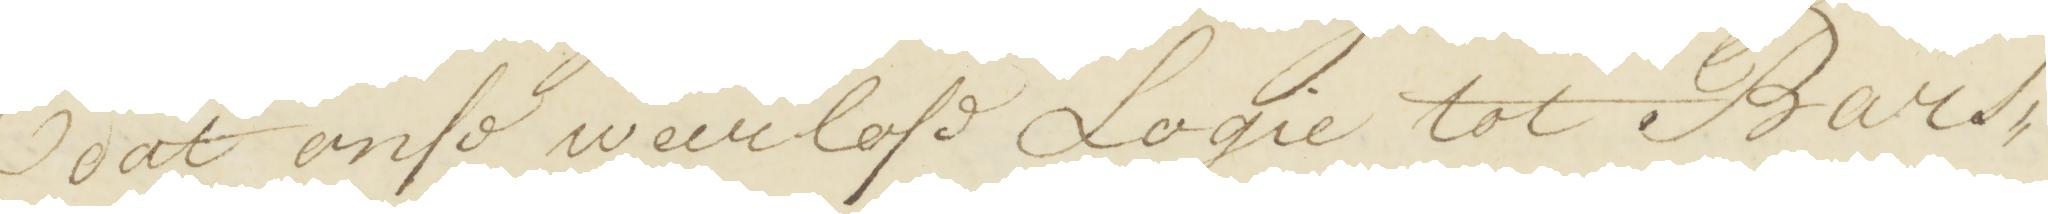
dat onse weerlose Logie tot Bars„
